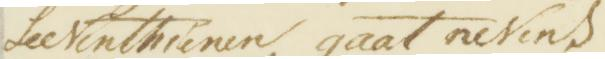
seeventhienen, gaat nevens
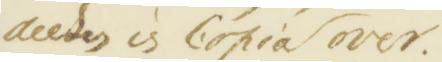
deesen is Copia over.
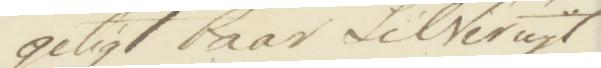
geligt baar silver uijt
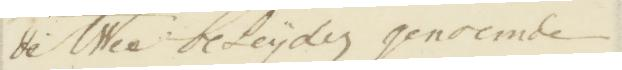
de twee beseijden genoemde
